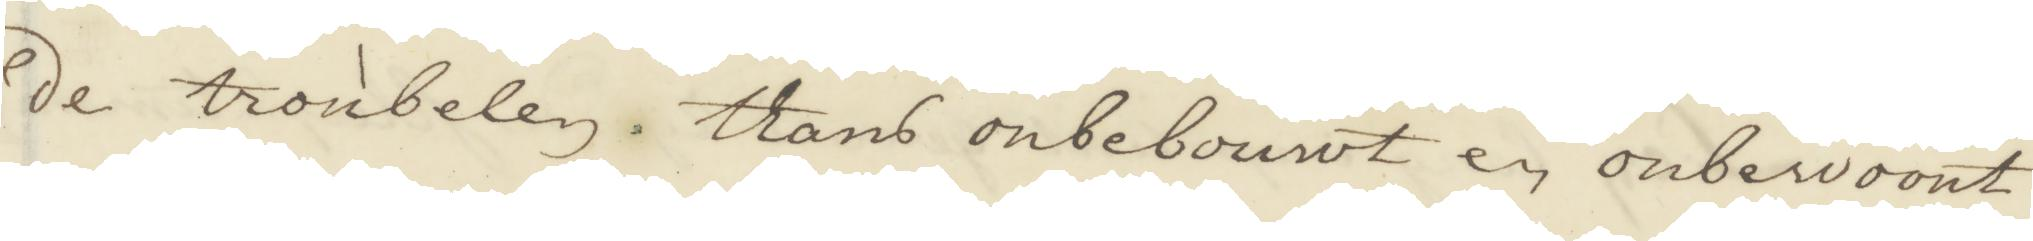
de troubelen thans onbebouwt en onbewoont
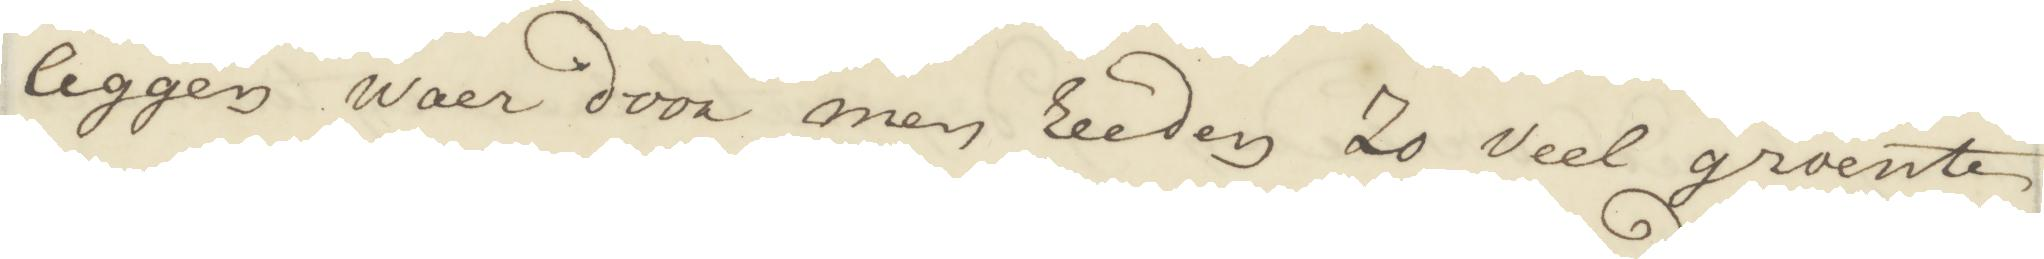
leggen waer door men heeden zo veel groente
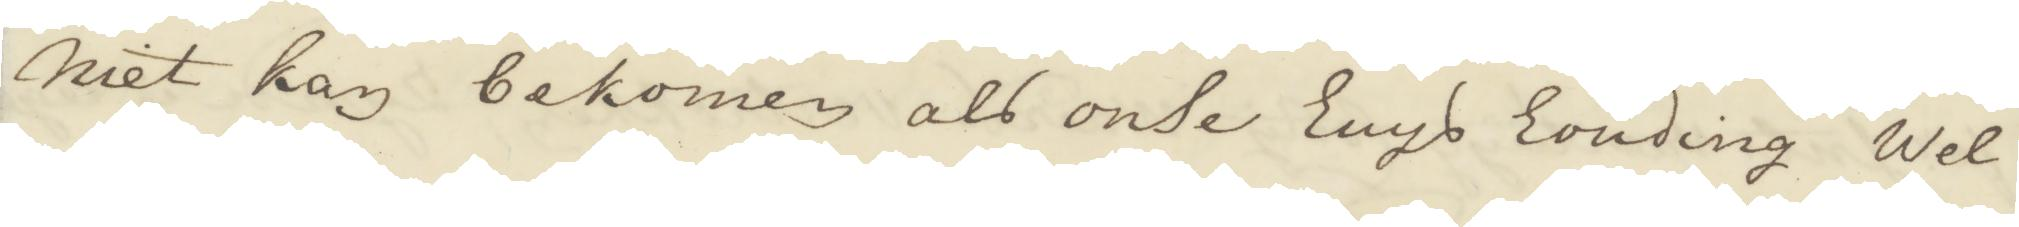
niet kan bekomen als onse huys houding wel
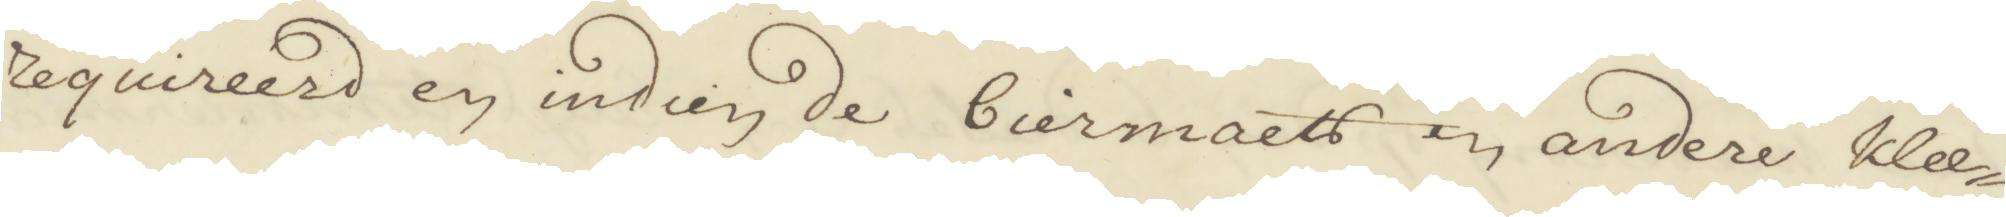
requireerd en indien de biermaets en andere klee=
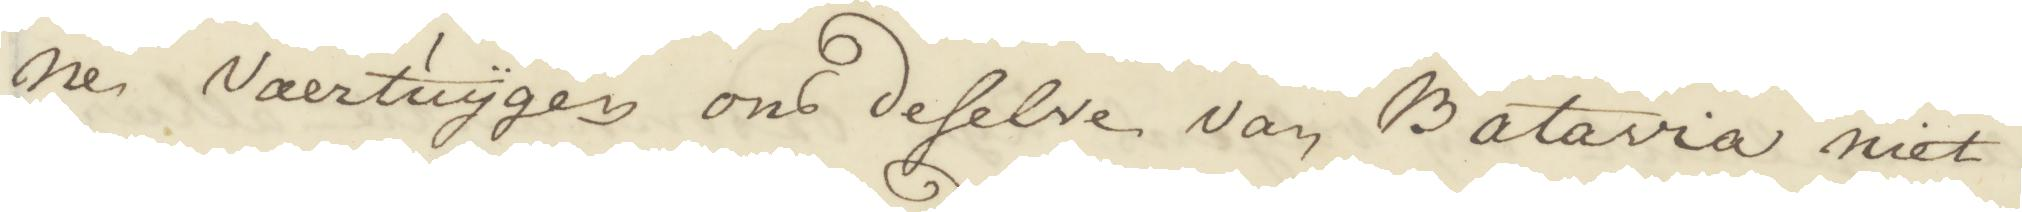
ne vaertuijgen ons deselve van Batavia niet
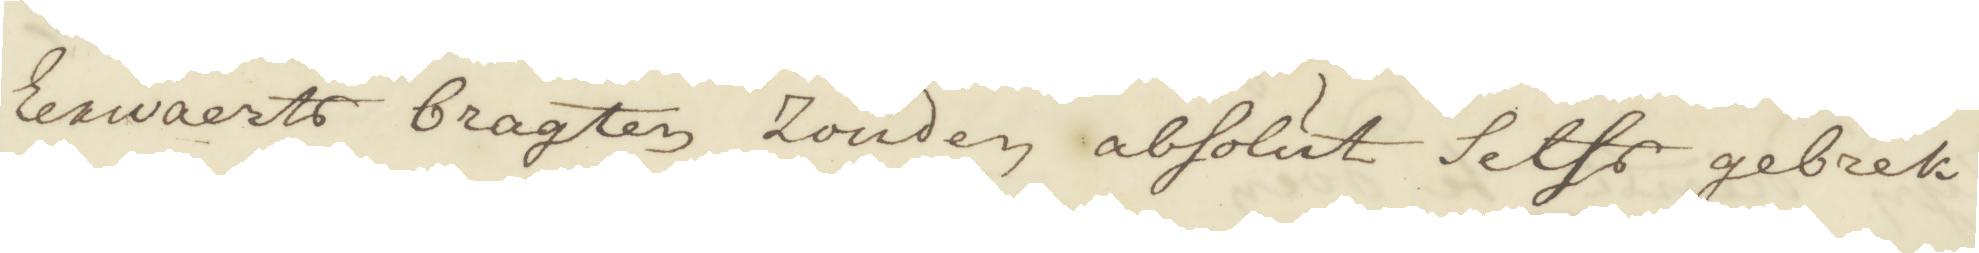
herwaerts bragten zouden absolut selfs gebrek
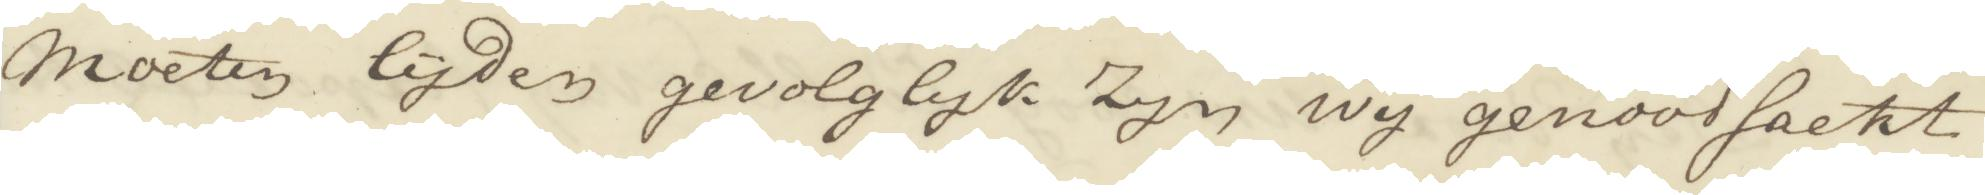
moeten ljden gevolglyk zyn wy genoodsaekt
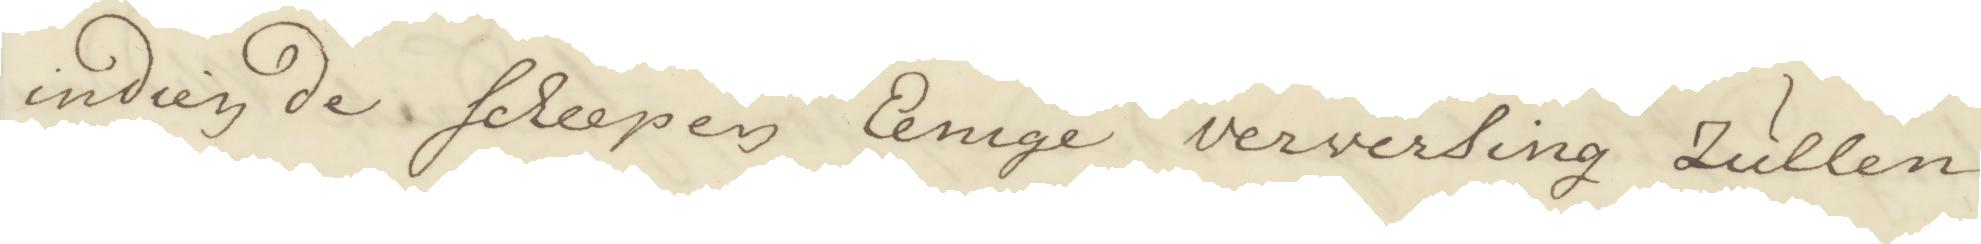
indien de scheepen Eenige verversing zullen
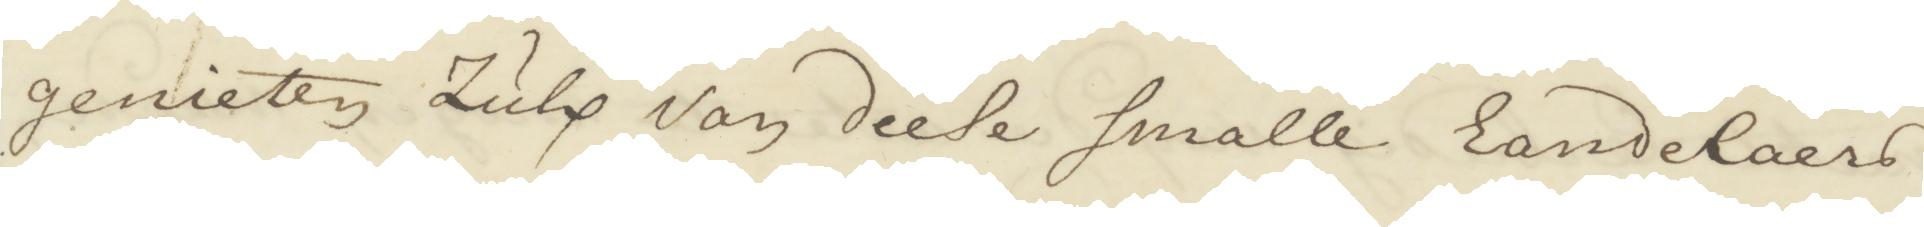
genieten zulx van deese smalle handelaers
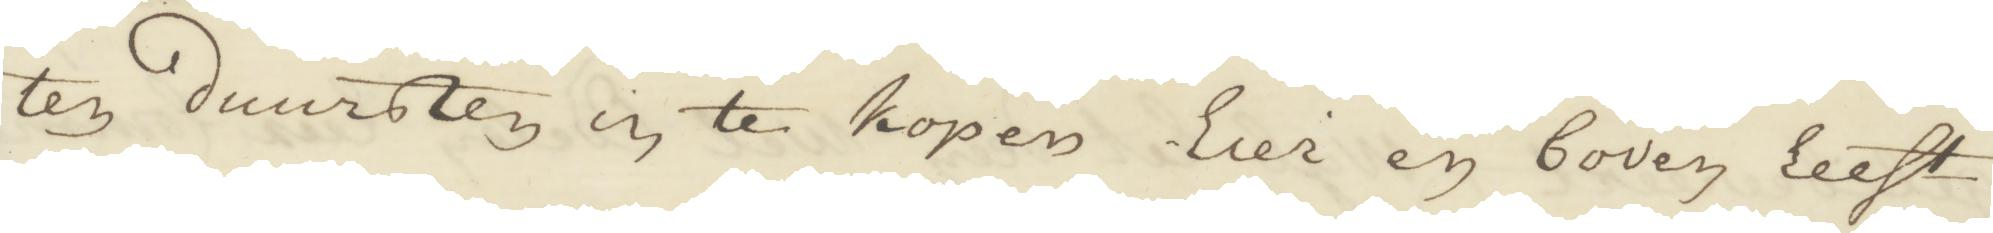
ten duursten in te kopen hier en boven heeft
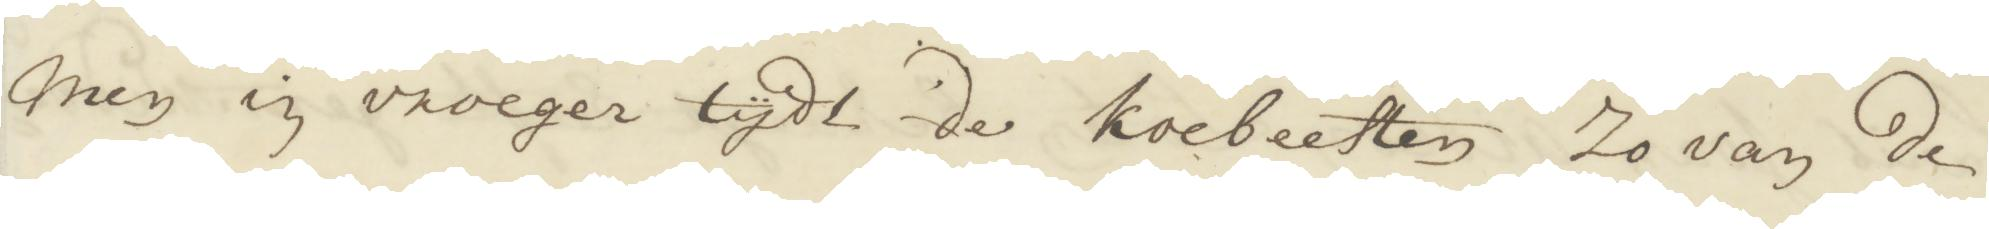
men in vroeger tijdt de koebeesten zo van de
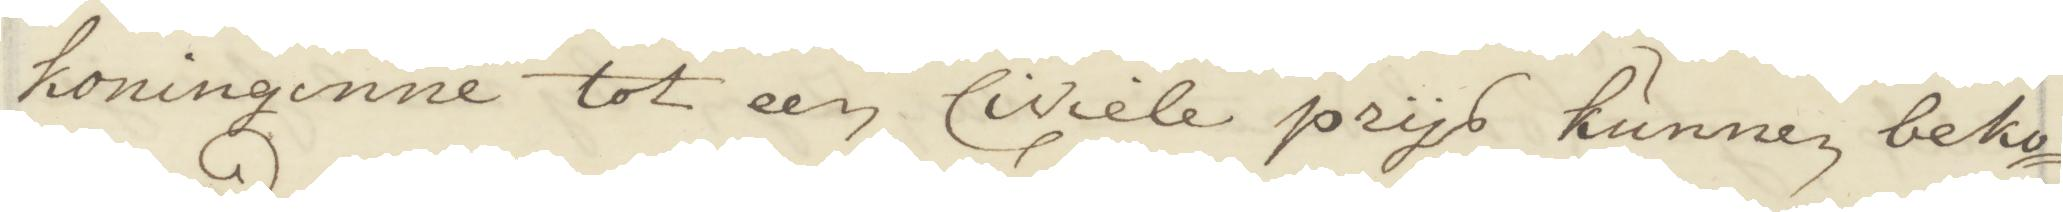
koninginne tot een Civiele prijs kunnen beko„
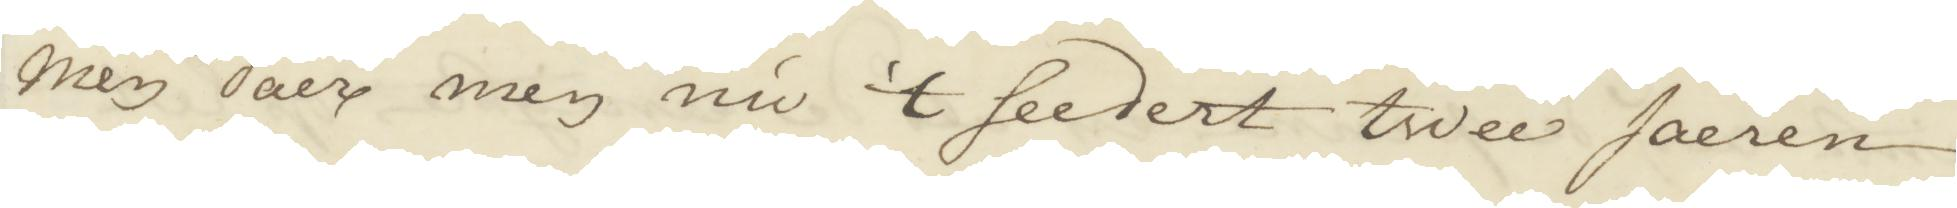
men daer men nu 't seedert twee jaeren
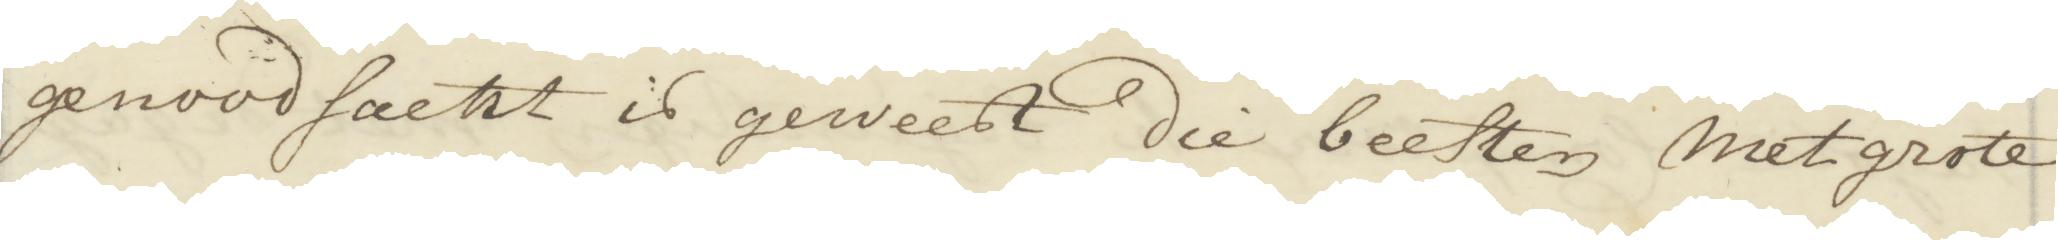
genoodsaekt is geweest die beesten met grote
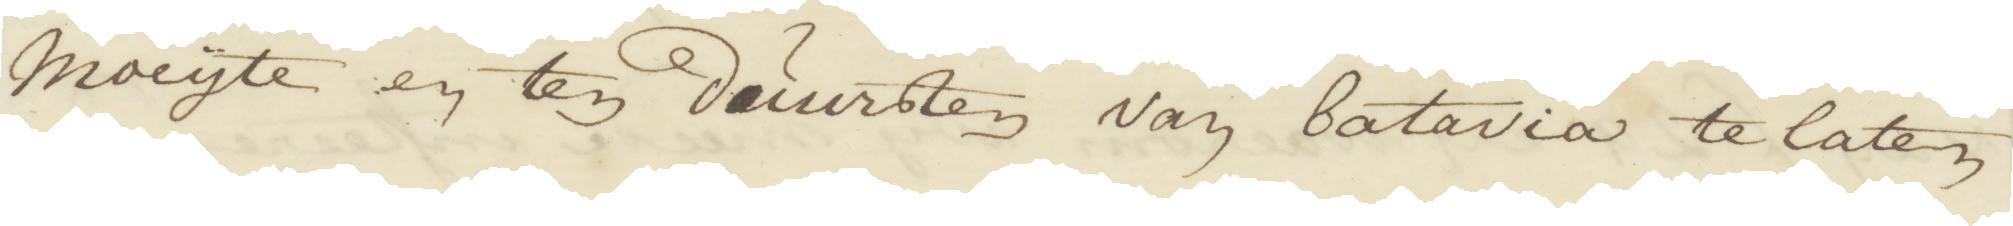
moeijte en ten duursten van batavia te laten
